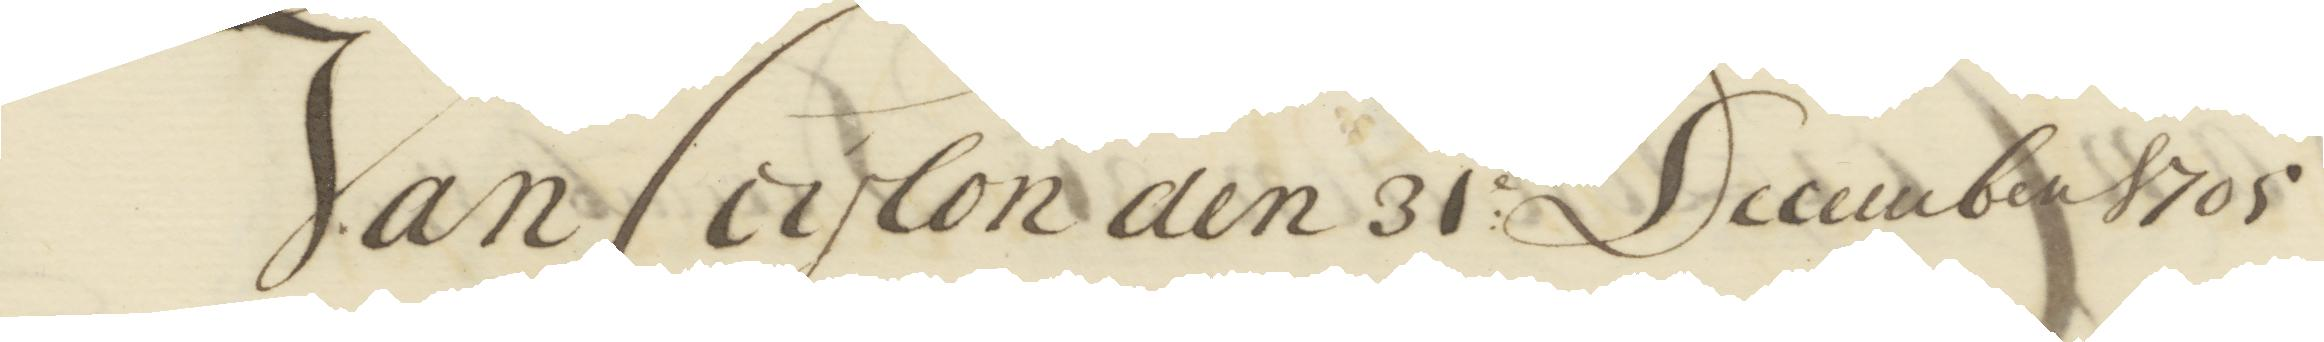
Van Ceijlon den 31:e December 1705
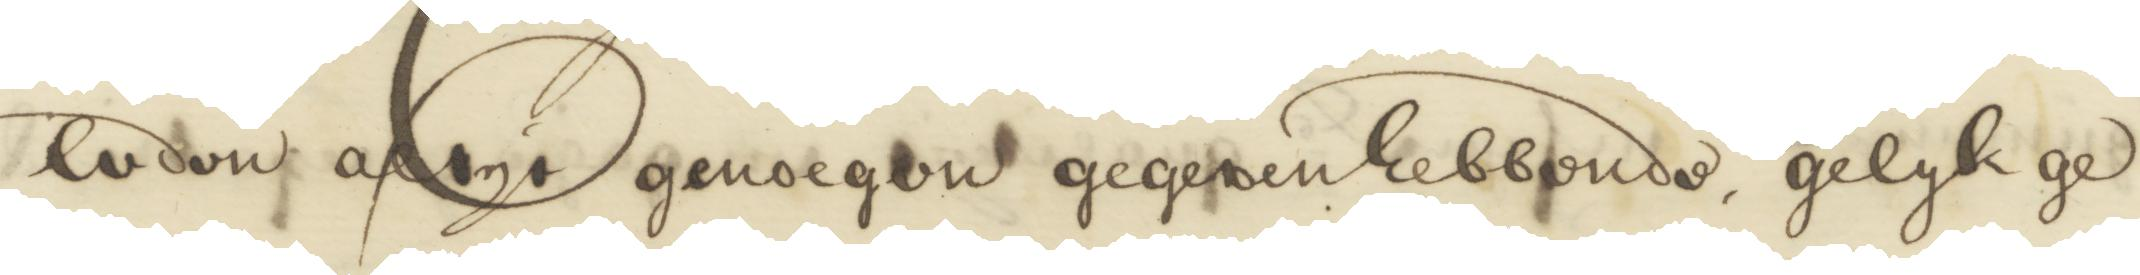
leden altijt genoegen gegevenhebbende, gelyk ge
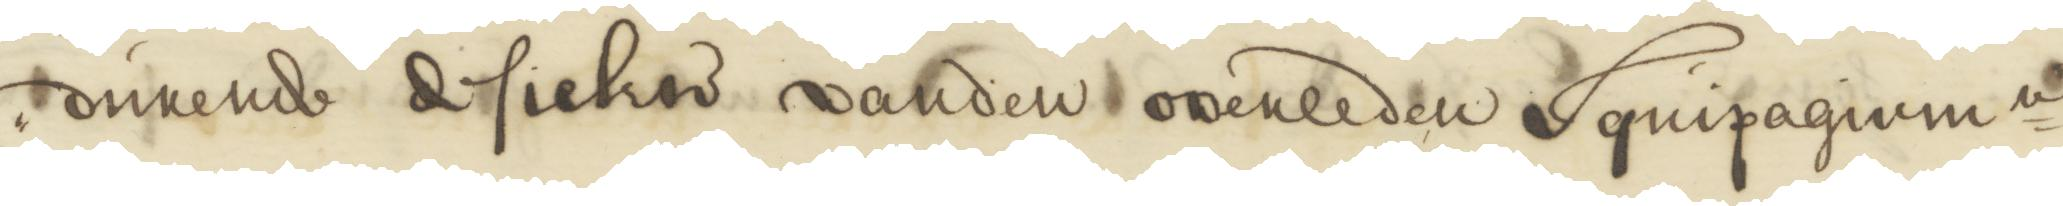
„durende desiekte vanden overleden Equipagiem=r
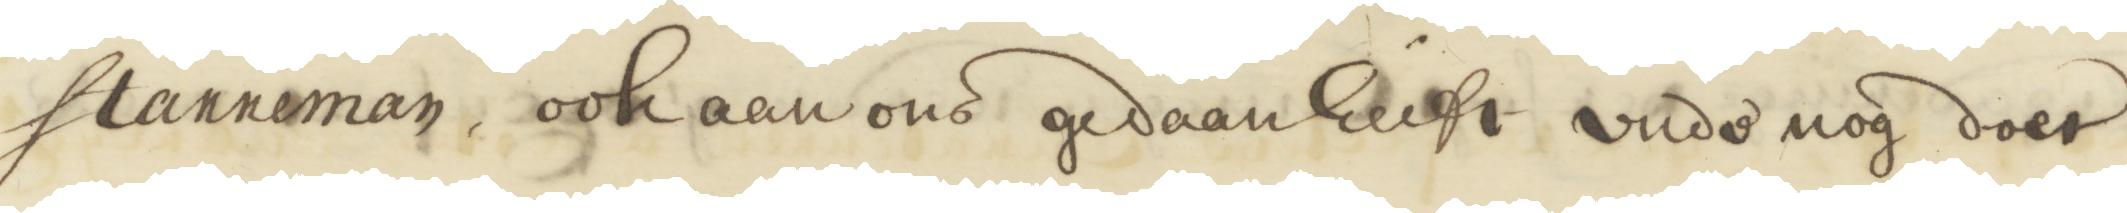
Starreman, ook aan ons gedaan heeft ende nog doet
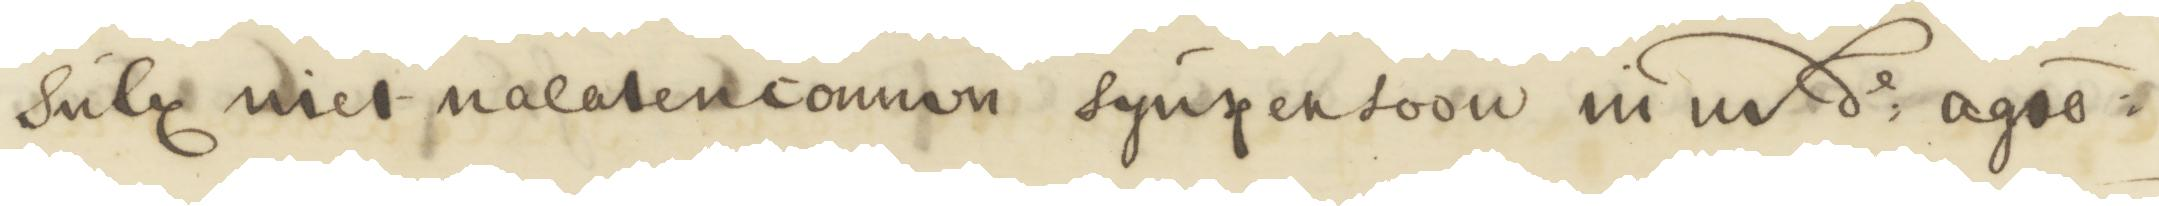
sulx niet nalatenconnen synpersoon in uEd:e agtb:
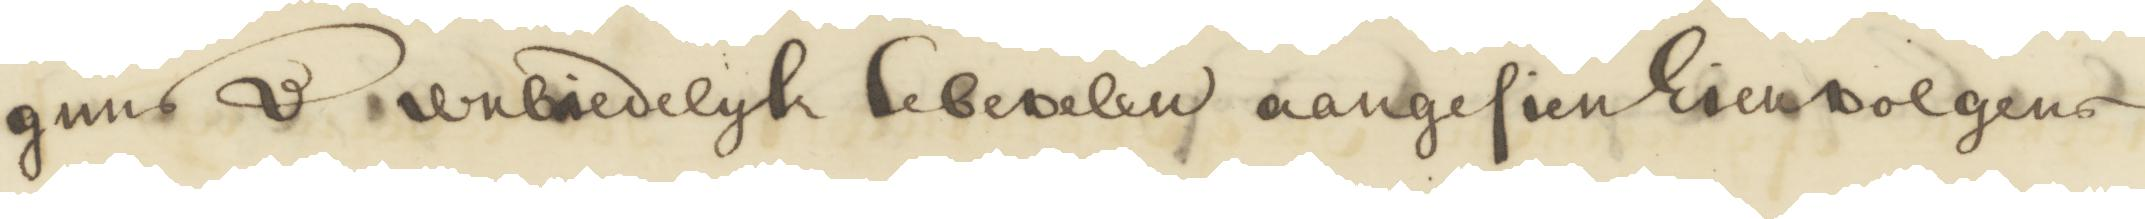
gunste eerbiedelijk te bevelen aangesien hier volgens
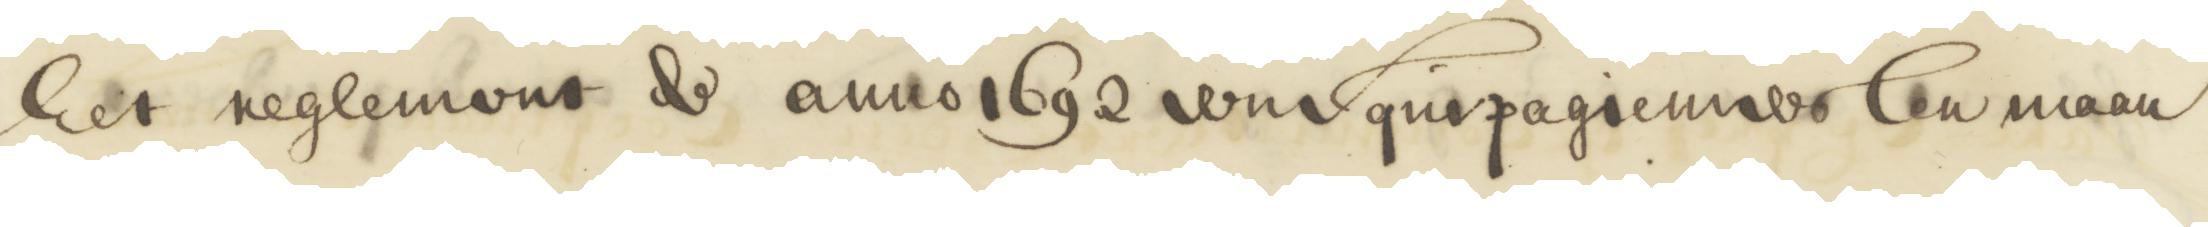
het reglement de anno 1692 eenEquipagiemeester maar
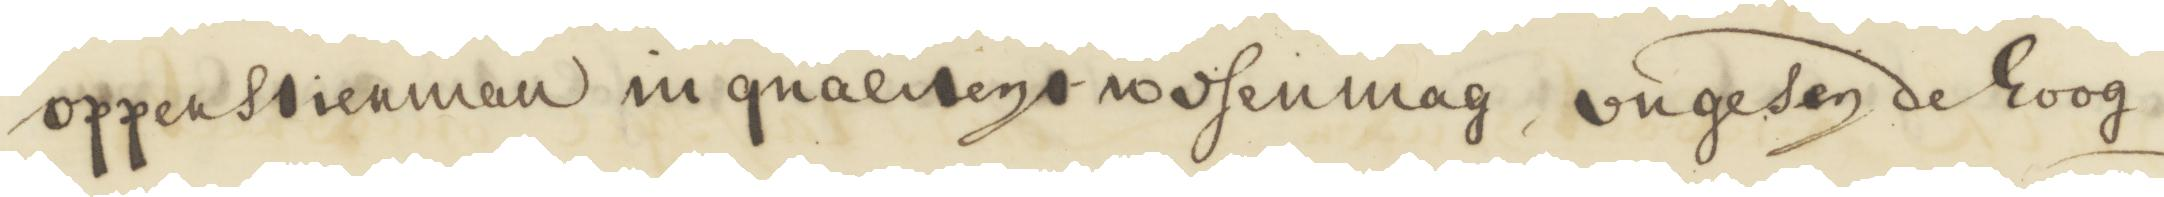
opperstierman in qualiteyt wesenmag, en gesey dehoog
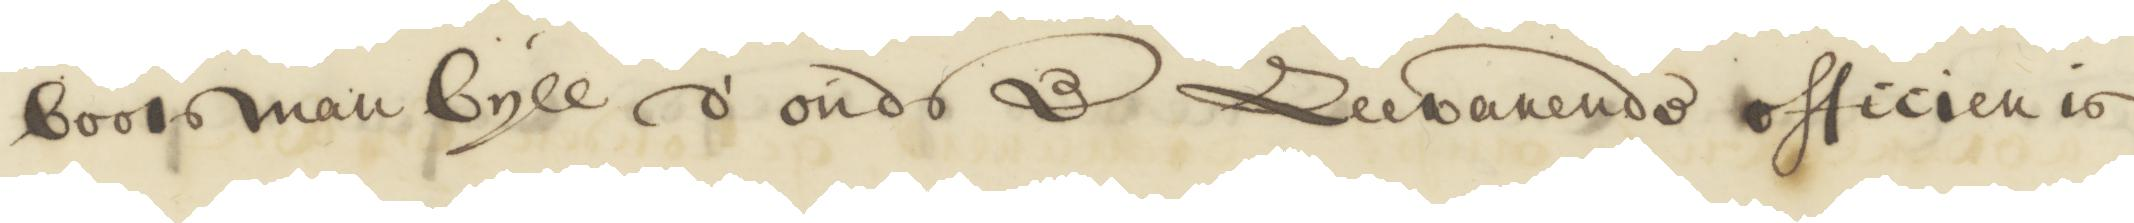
bootsman bijll d’ oudste Zeevarende officier is
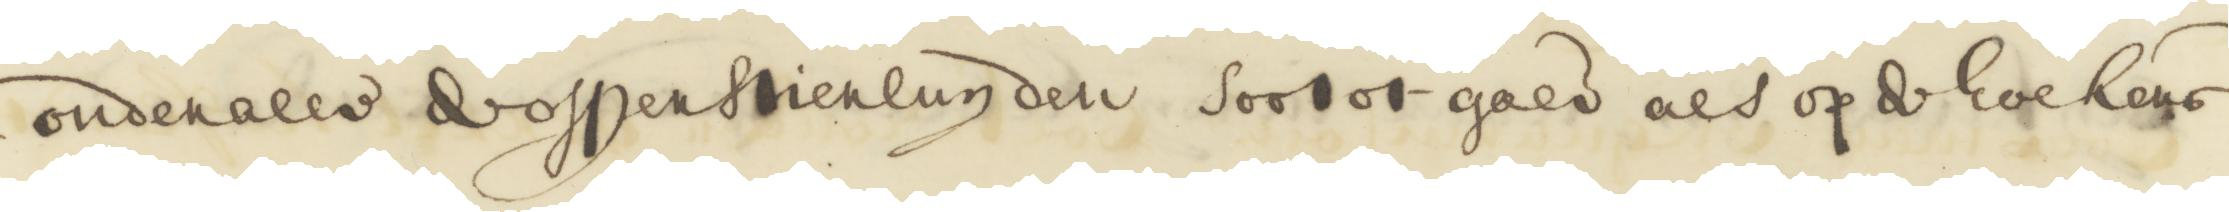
onderalle deopperstierluijden sootot goed als op de hoekers
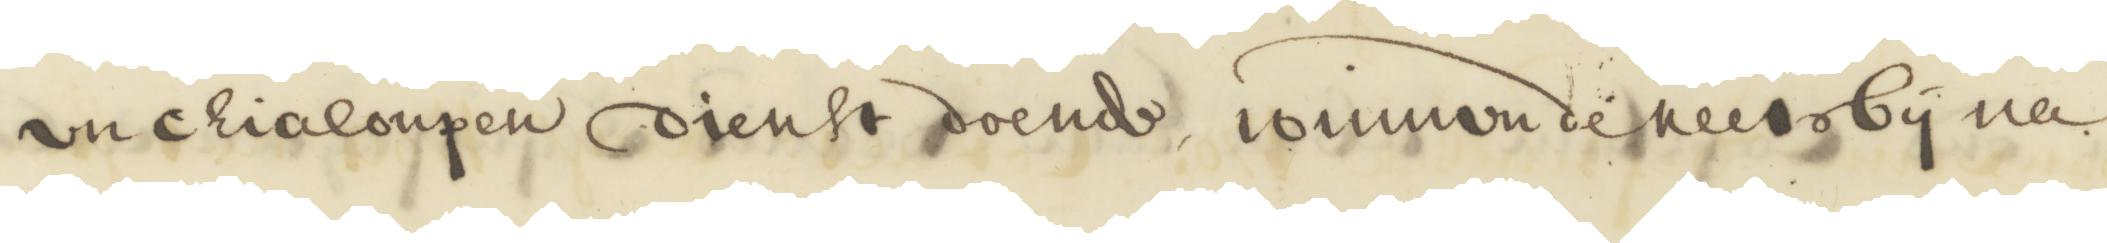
en chialoupen dienst doende, winnen dereetsbij na
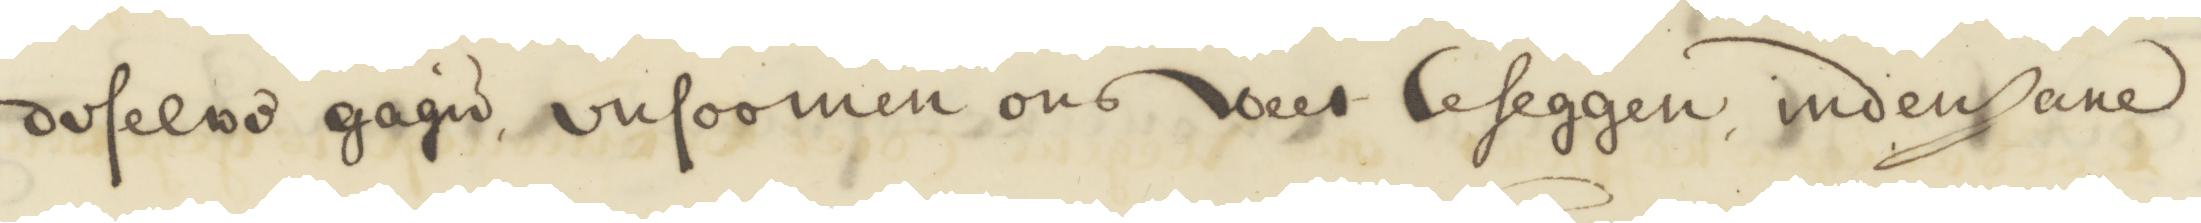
deselve gagie, ensoomen ons weet te seggen, indenjare
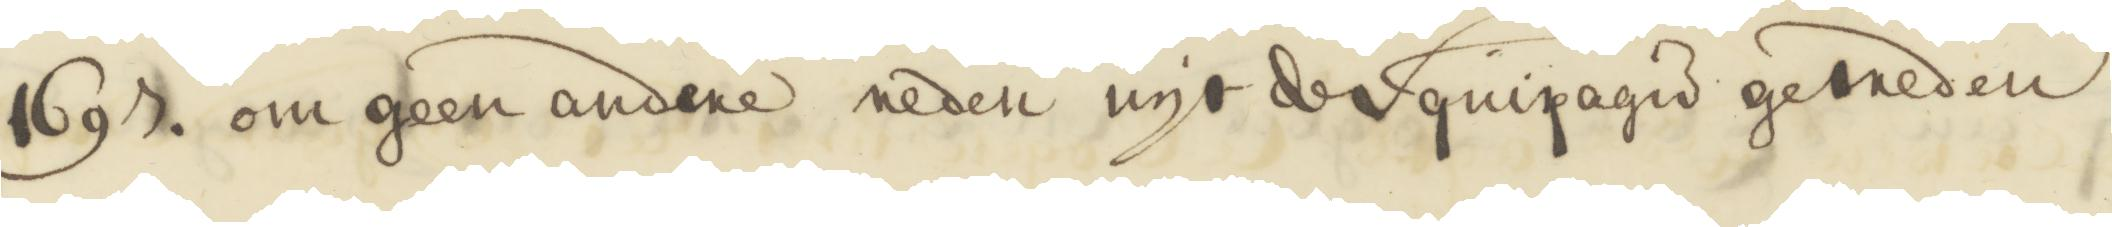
1697. om geen andere reden uijt de Equipagie getreden
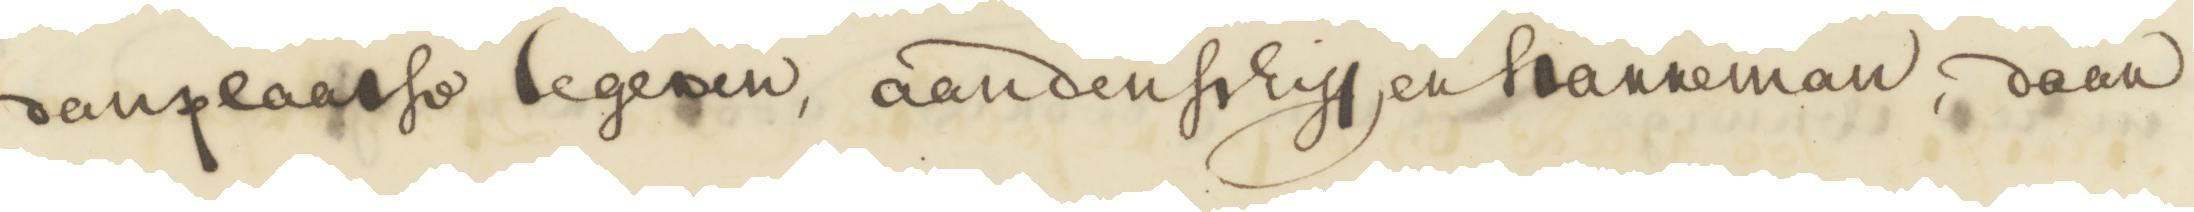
danplaatse tegeven, aan den schijf en starreman, daar
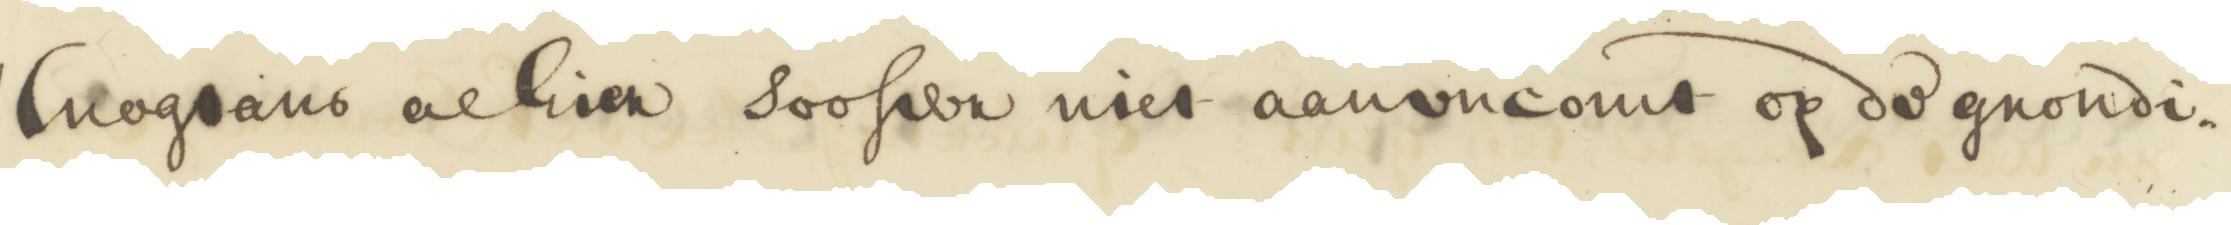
'tnogtans alhier sooseer niet aanencomt op de grondi„
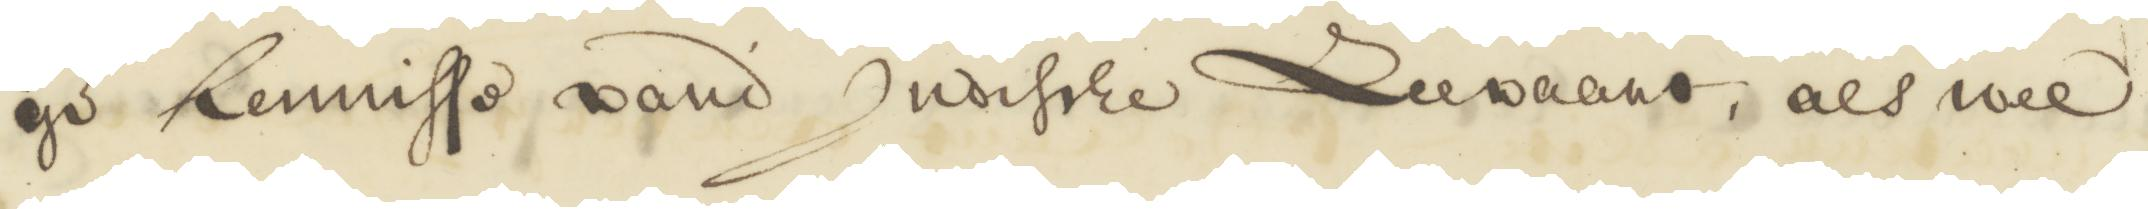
ge kennisse vand jndische Zeevaart, als wel
